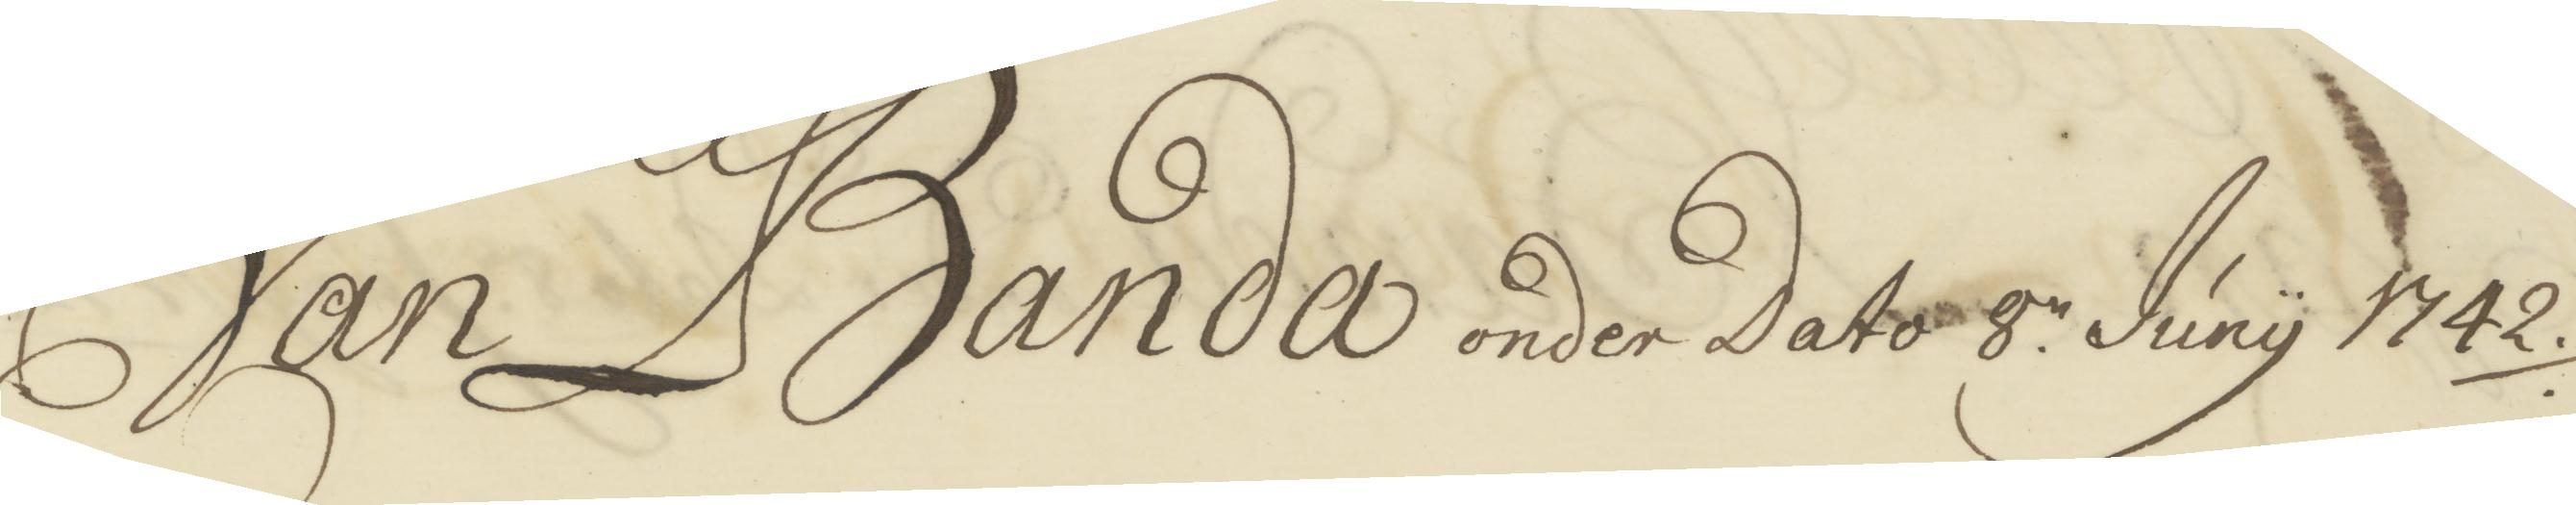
Van Banda onder dato 8:n Junij 1742./.
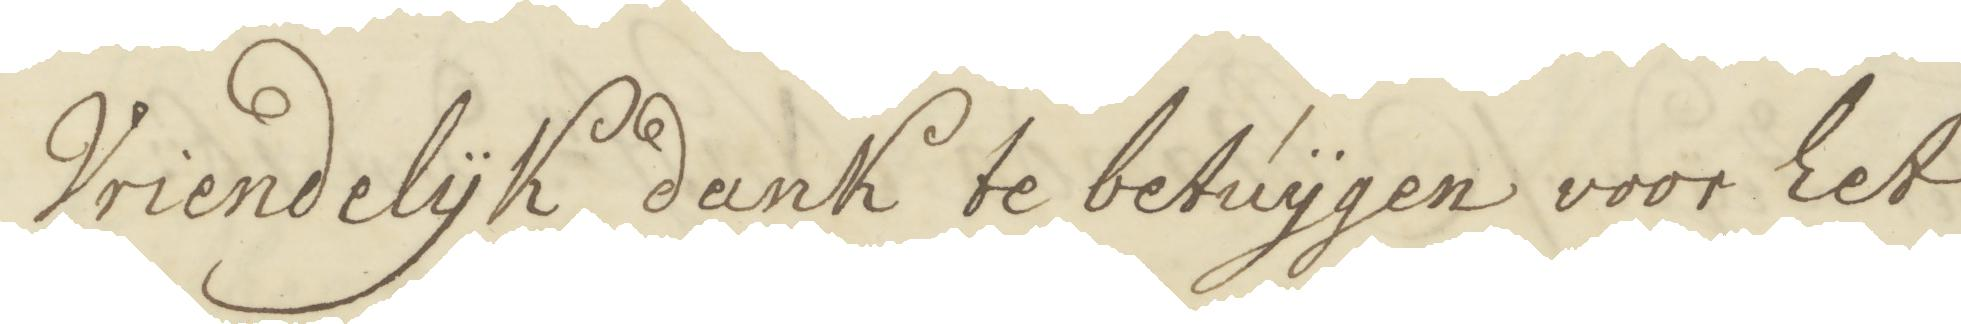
Vriendelijk dank te betuijgen voor het
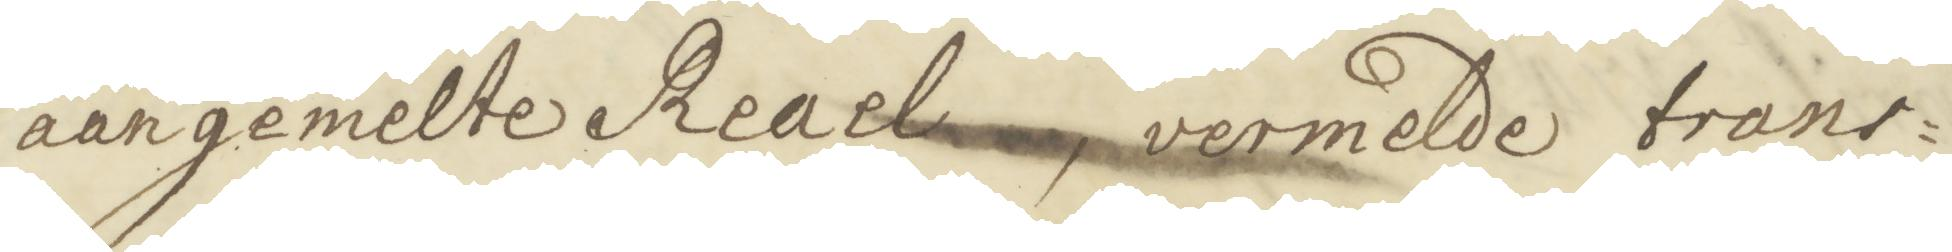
aan gemelte Reael, vermelde trans=
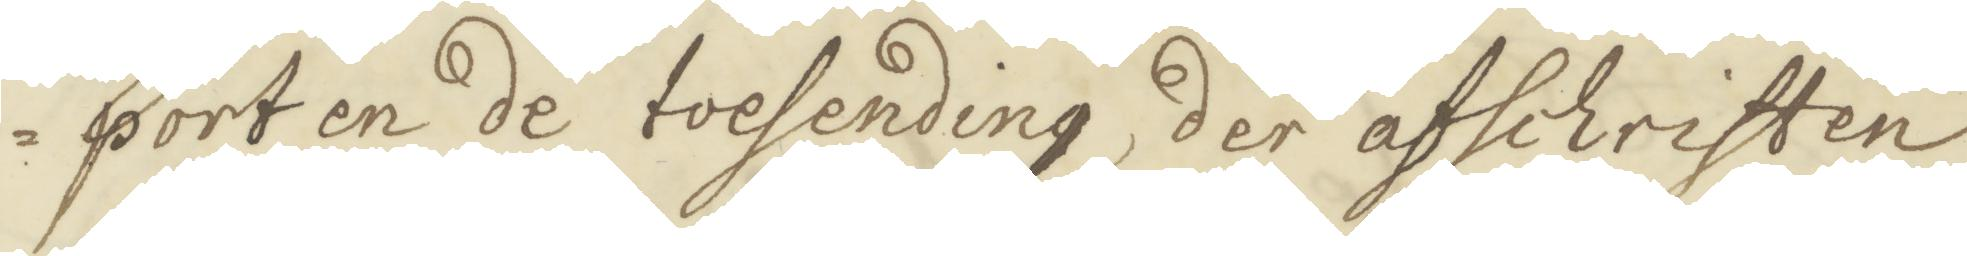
„port en de toesending der afschriften
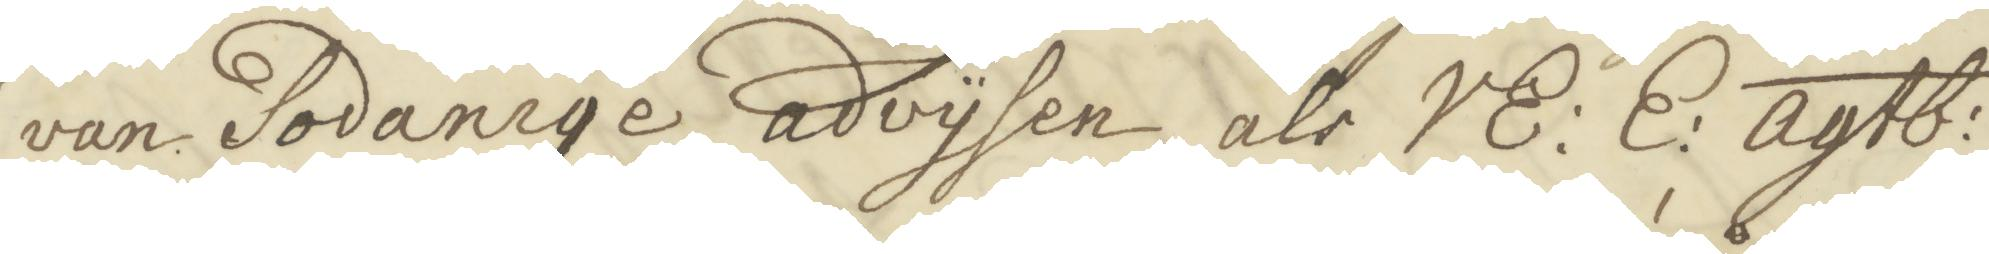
van sodanige advijsen als VE: E: agtb:
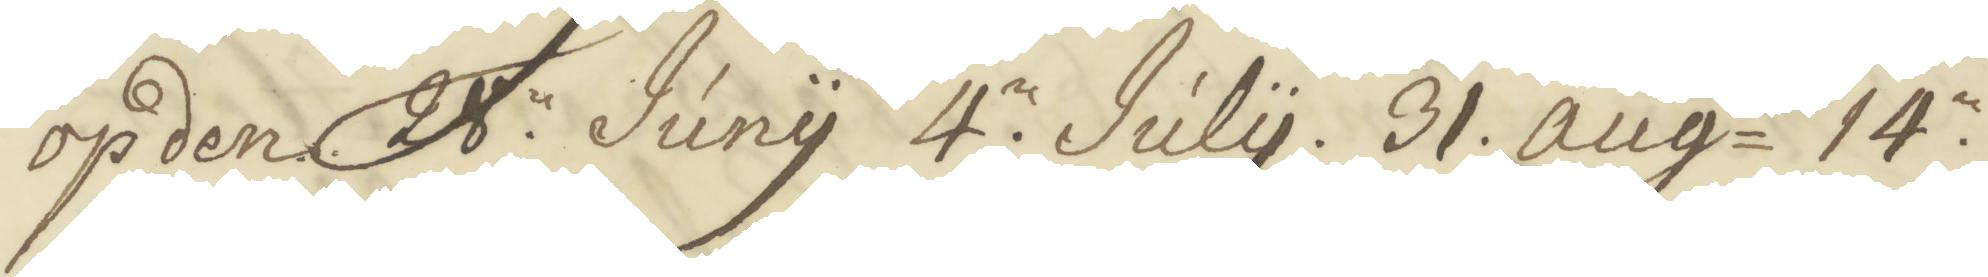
op den 28.n Iunij 4:n Iulij. 31. aug=o 14.n
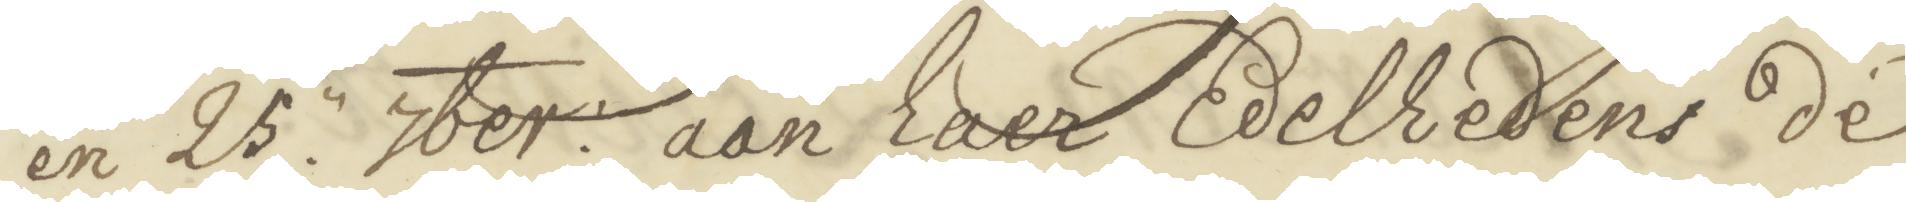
en 25.n 7ber: aan haer Edelhedens de
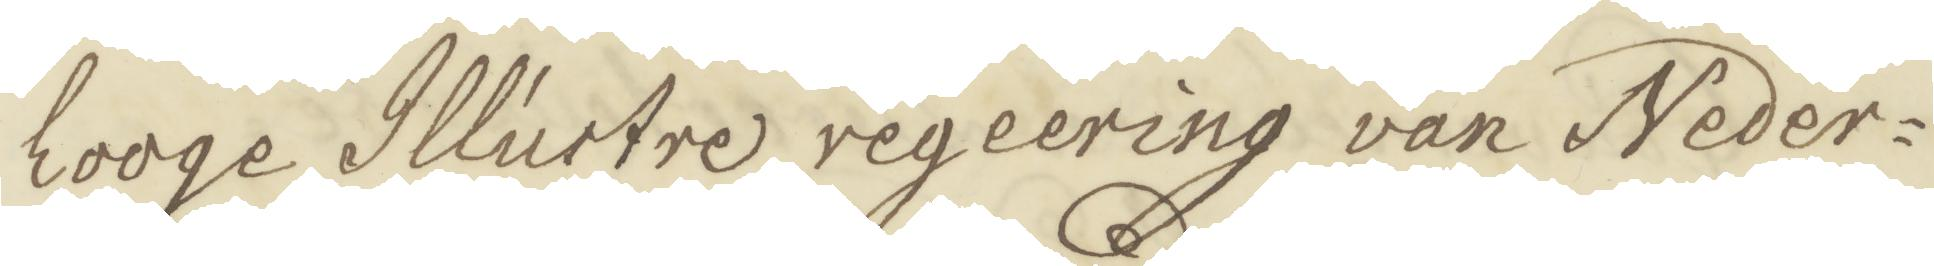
hooge Illustre regeering van Neder=
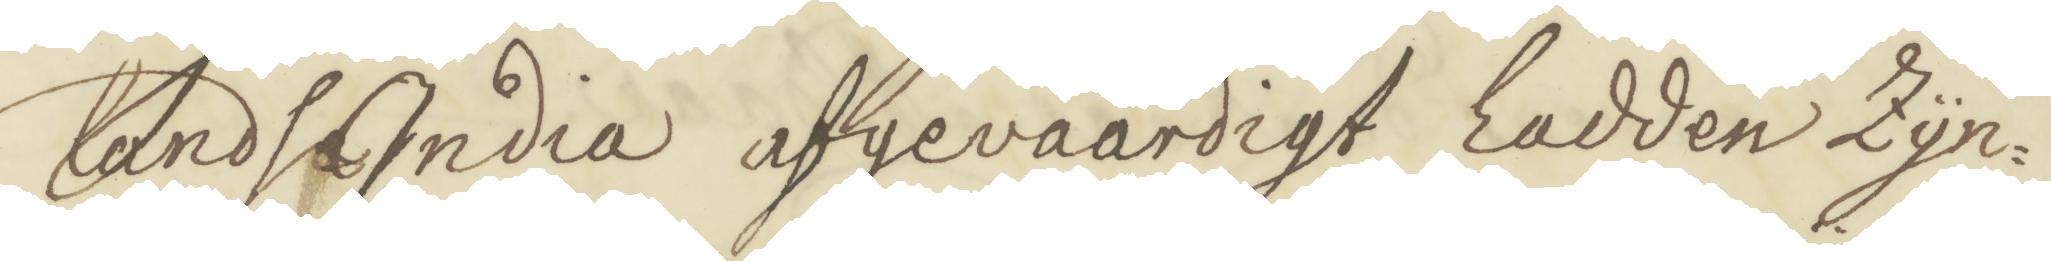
lands India afgevaardigt hadden zijn=
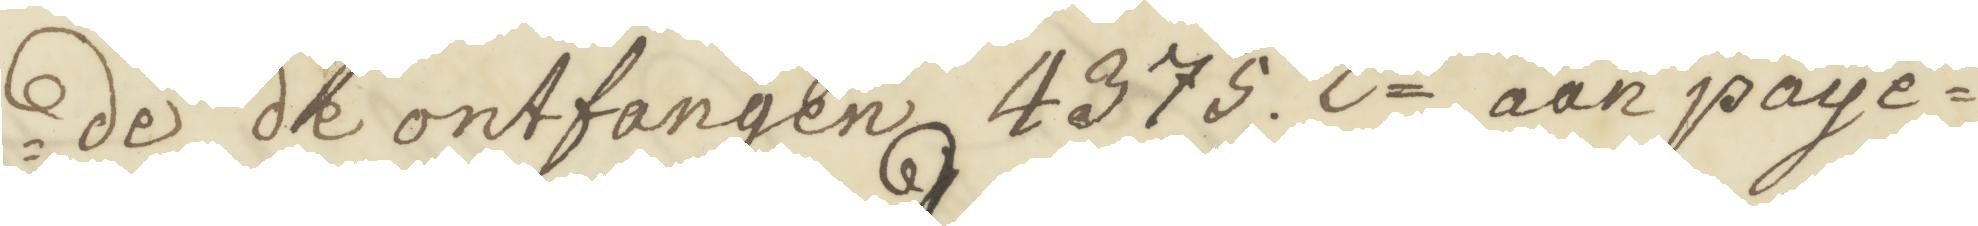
=de de ontfangen 4375. rd=s aan paije=
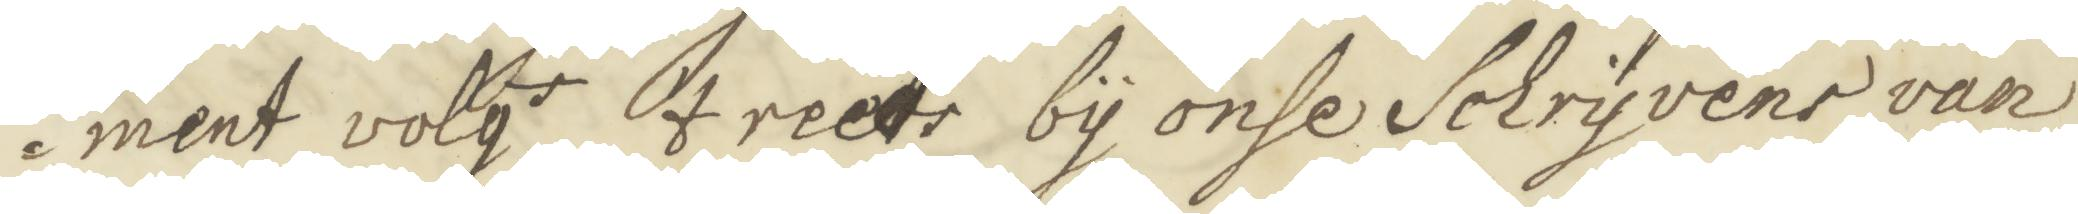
= ment volgs 't reeds bij onse schrijvens van
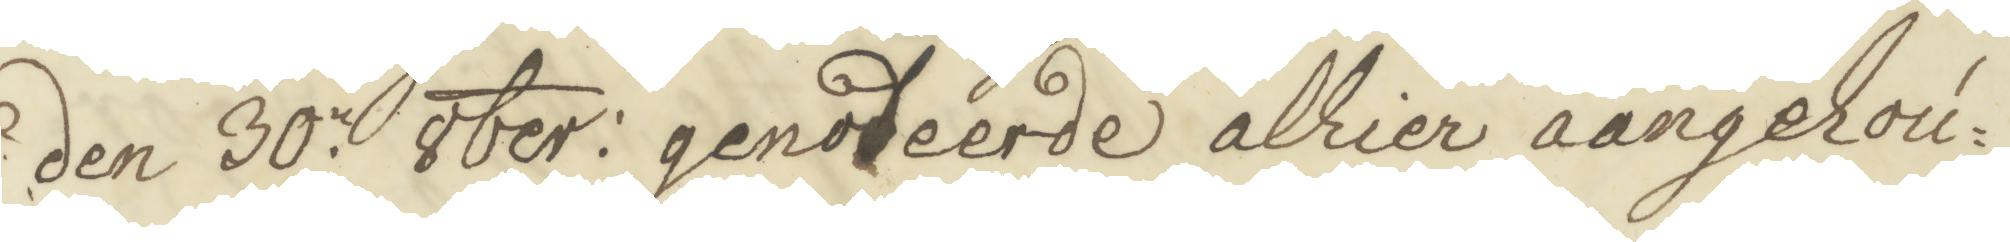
den 30:n 8ber: genoteerde alhier aangehou=
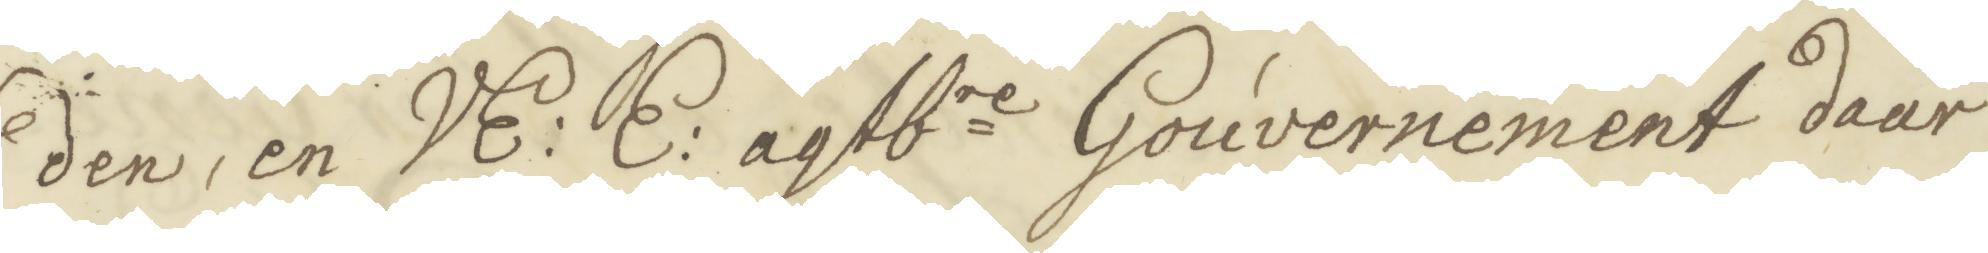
den, en VE: E: agtb=re Gouvernement daar
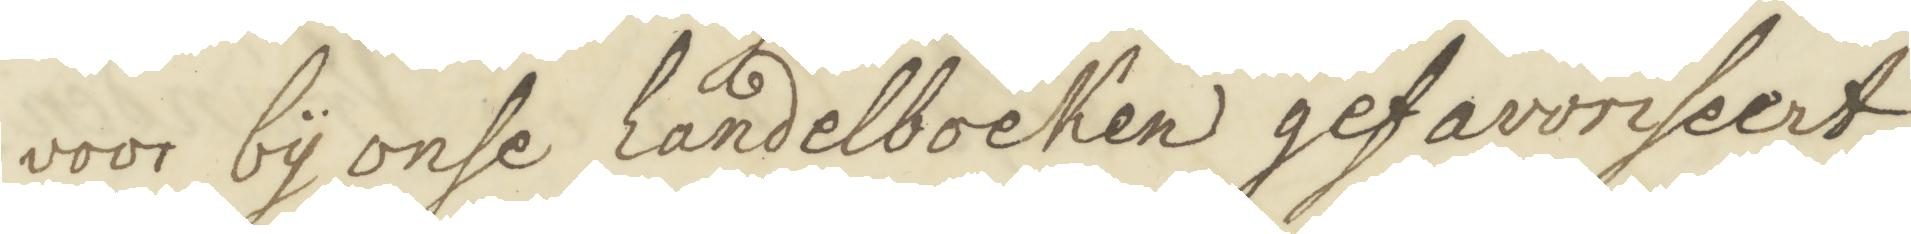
voor bij onse handelboeken gefavoriseert
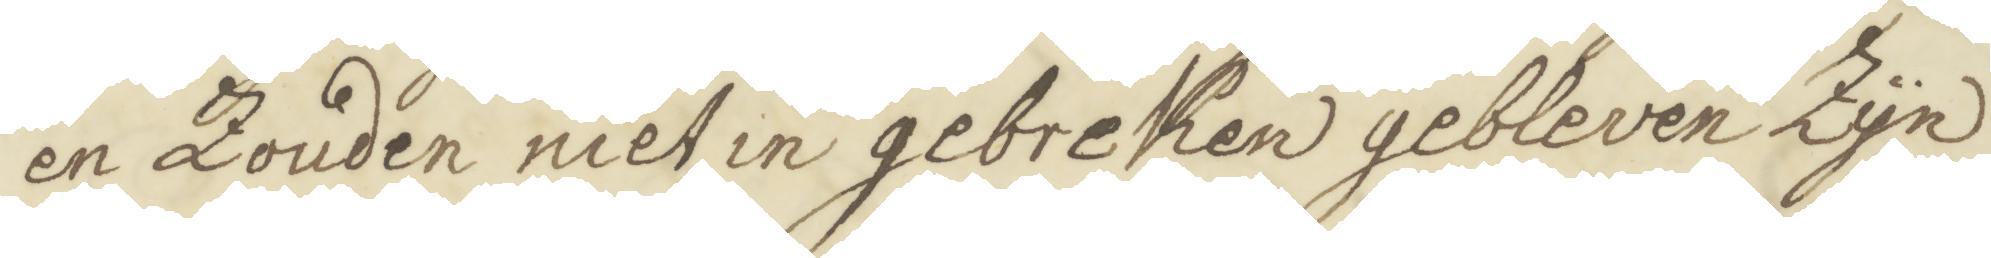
en zouden niet in gebreken gebleven zijn,
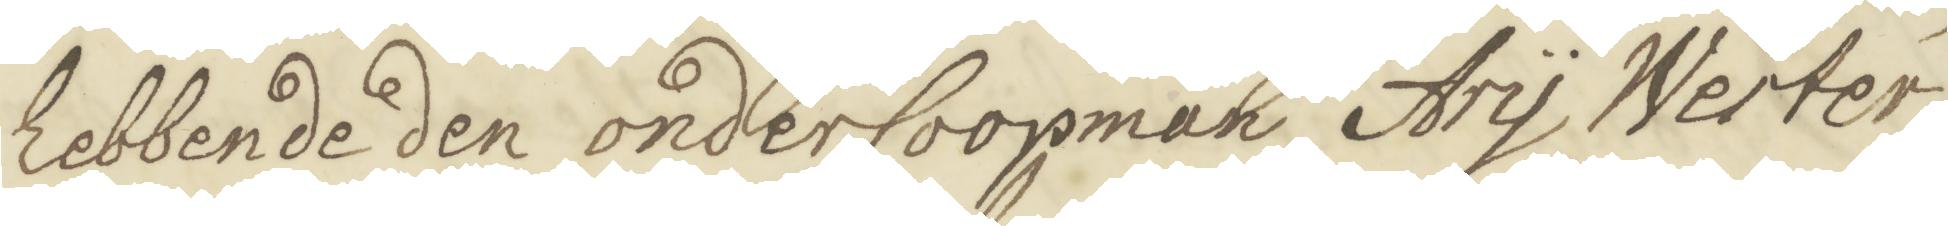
hebbende den ondercoopman, Arij Wester:
